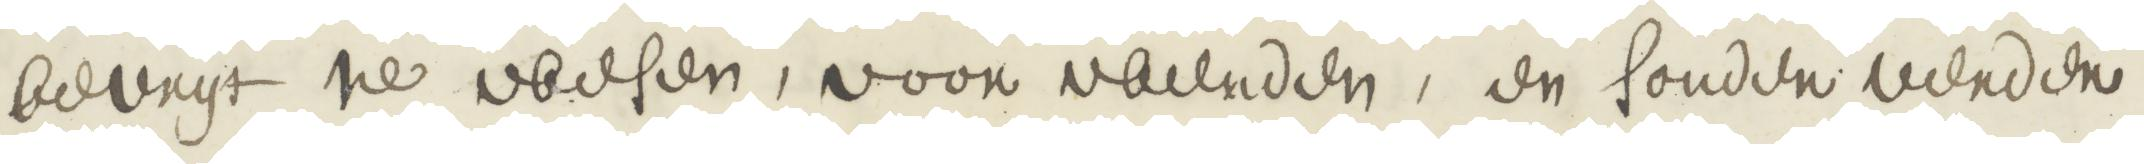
bevrijt te wesen, voor werden, en sonder verder
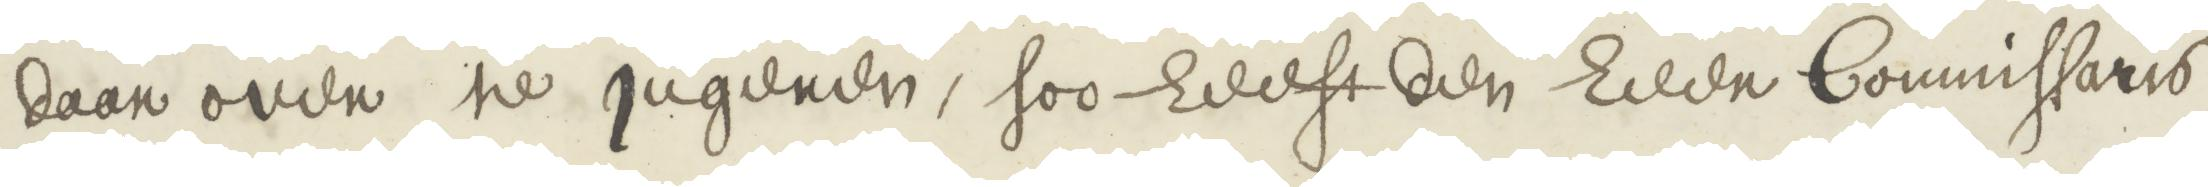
daar over te jugeren, soo heeft den heer Commissaris
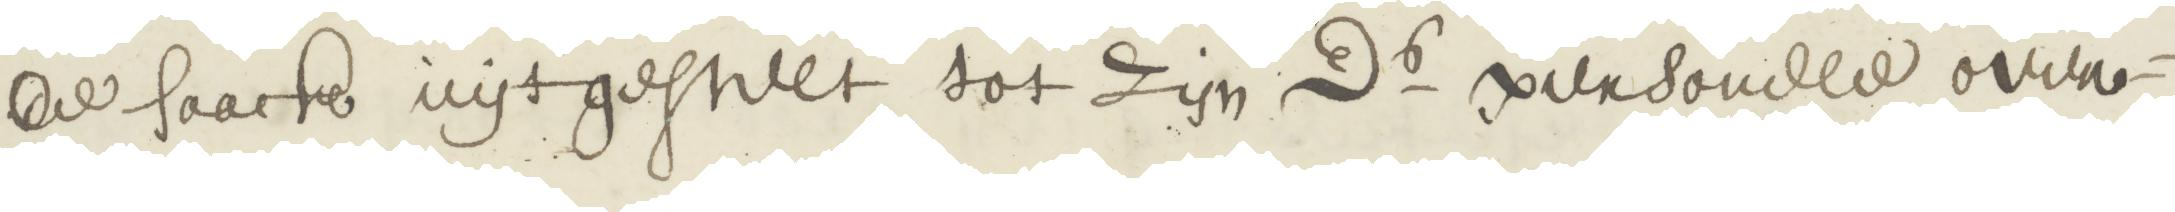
de saack uijtgestelt tot Zijn E=s personele over=
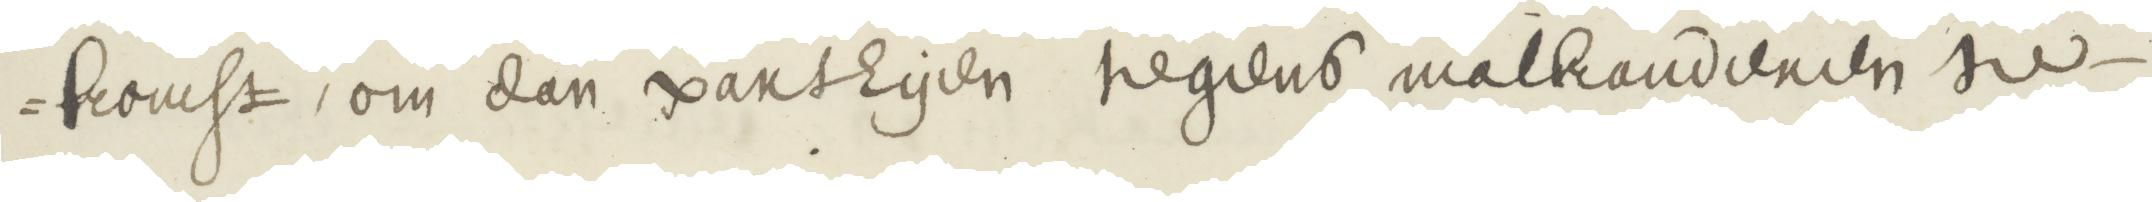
=komst, om dan parthijen tegens malkanderen te
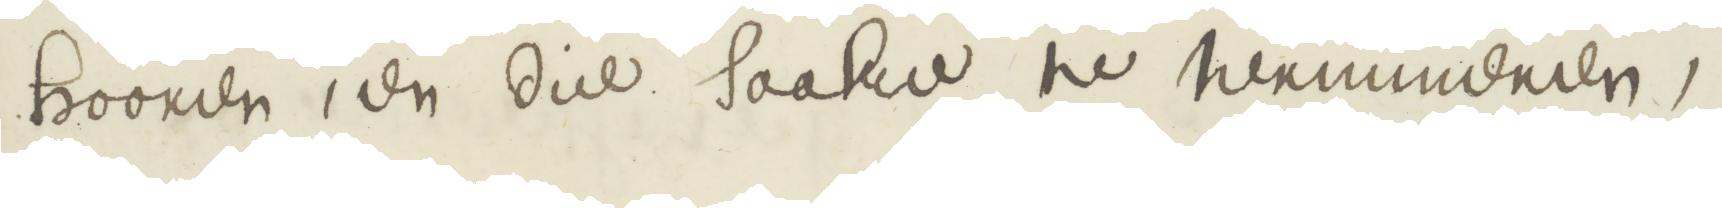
hooren,en die saake te termineren,
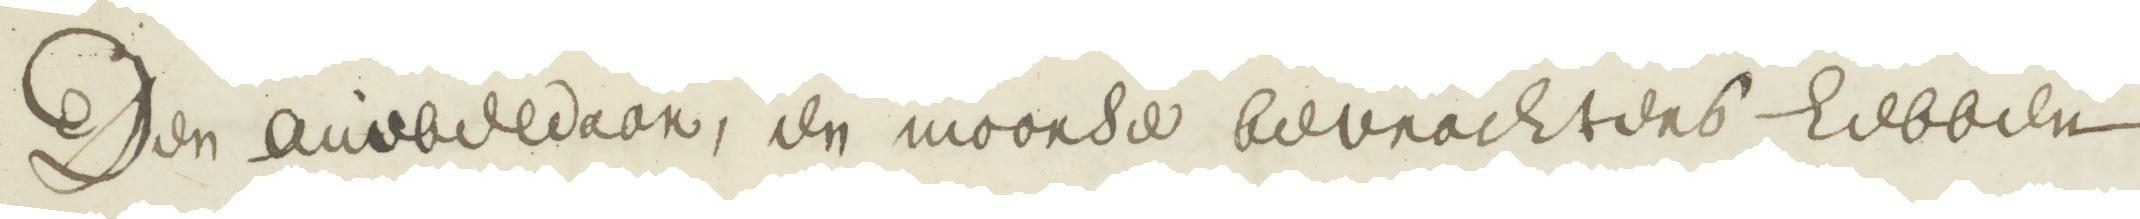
Den auweldaar, en moorse bevrachters hebben
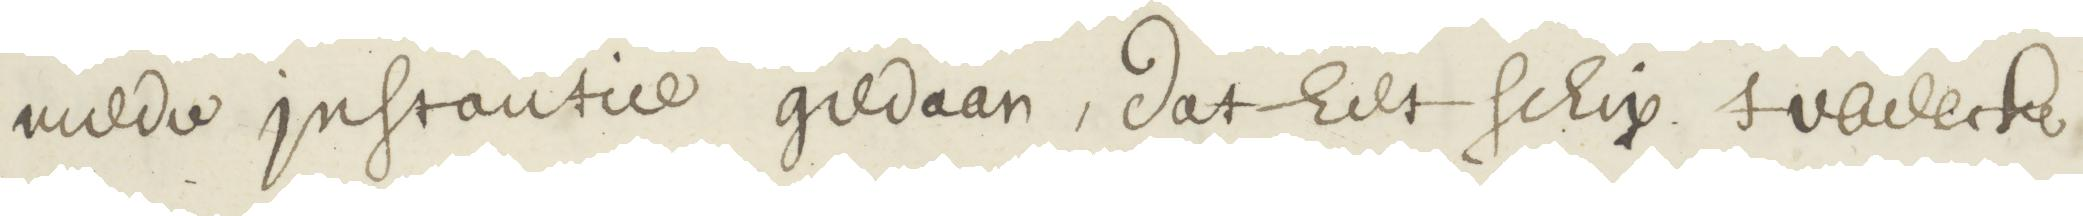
mede jnstantie gedaan, dat het schip t welck
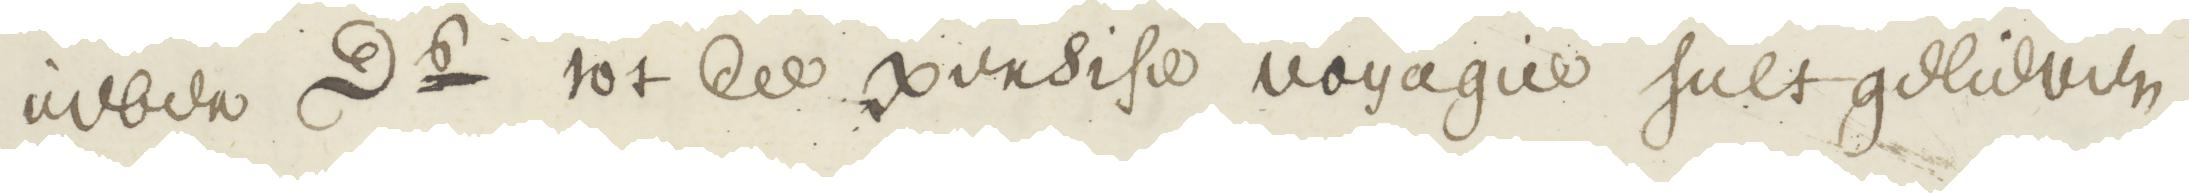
uwer E=s tot de persise voyagie sult gelieven
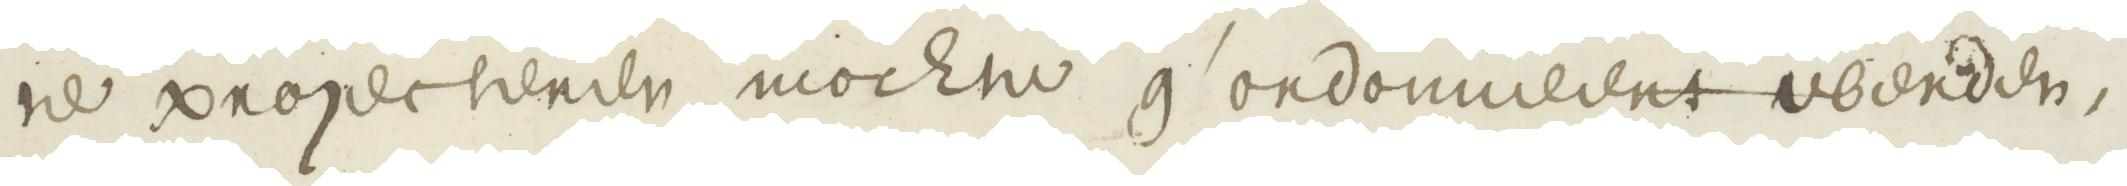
te projecteren mochte g’ordonneert werden,
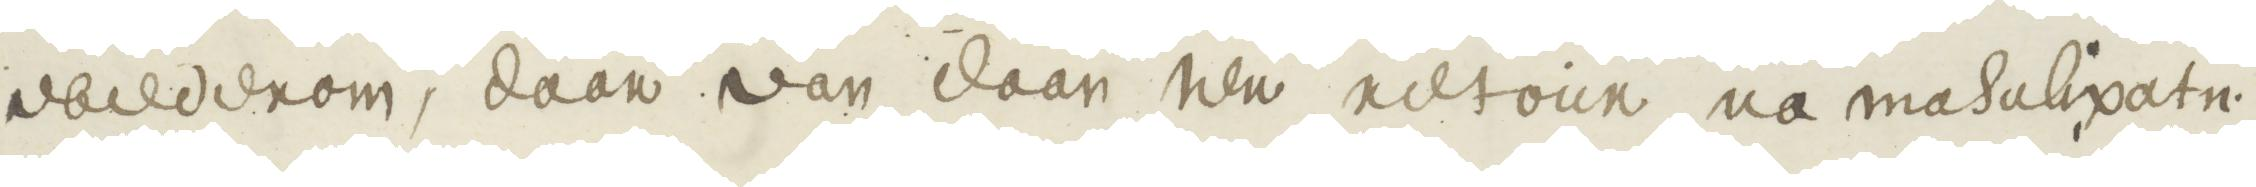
wederom, daar van daan ter retour na masulipatn.
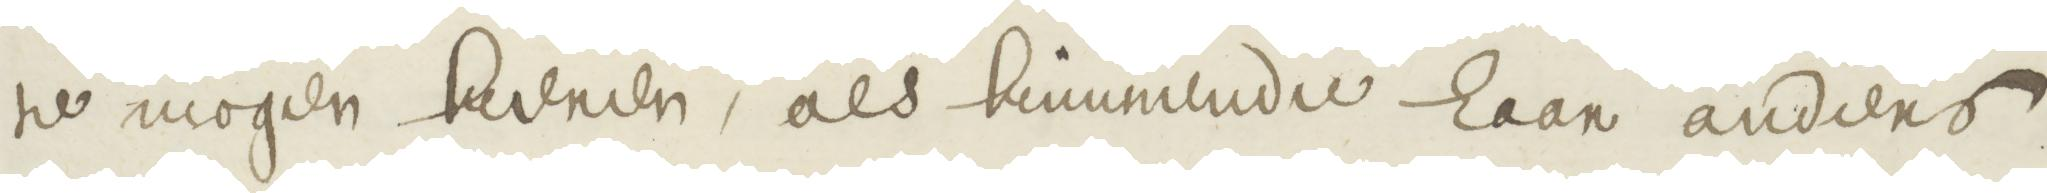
te mogen keren, als kunnende haar anders
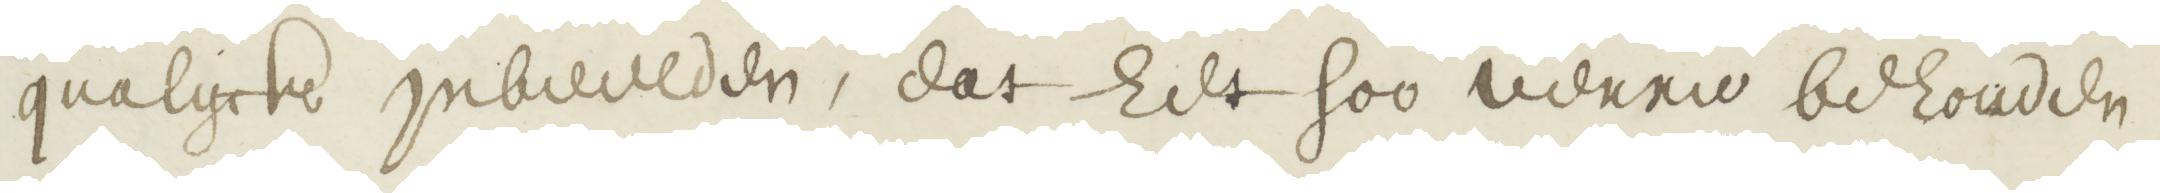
qualijck jnbeelden, dat het soo verre behouden
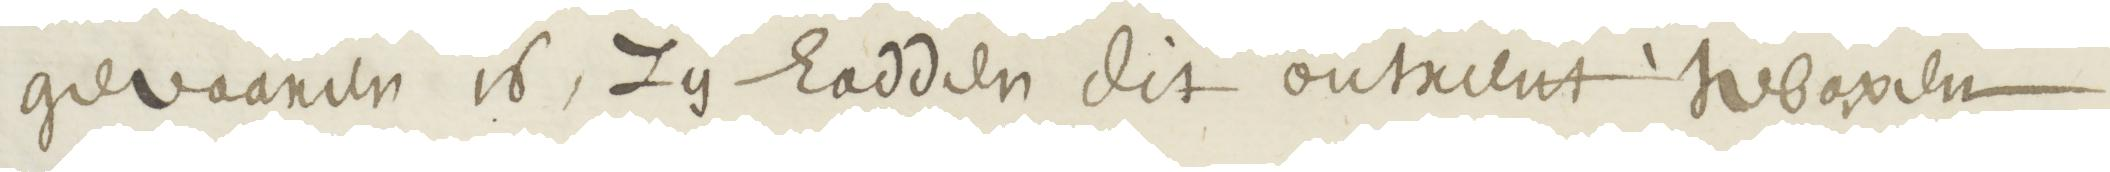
gevaaren is, Zij hadden dit ontrent 't wapen
